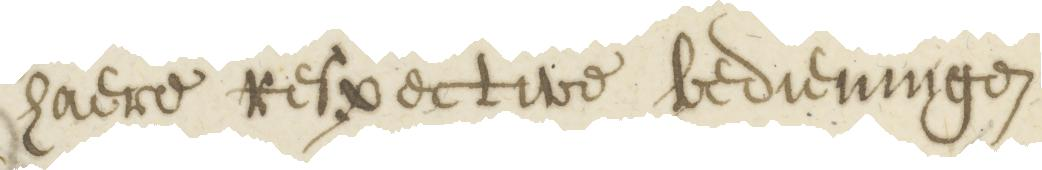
haere respective bedieningen
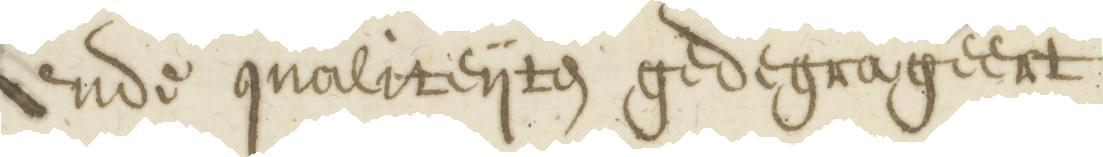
ende qualiteijten gedegrageert
